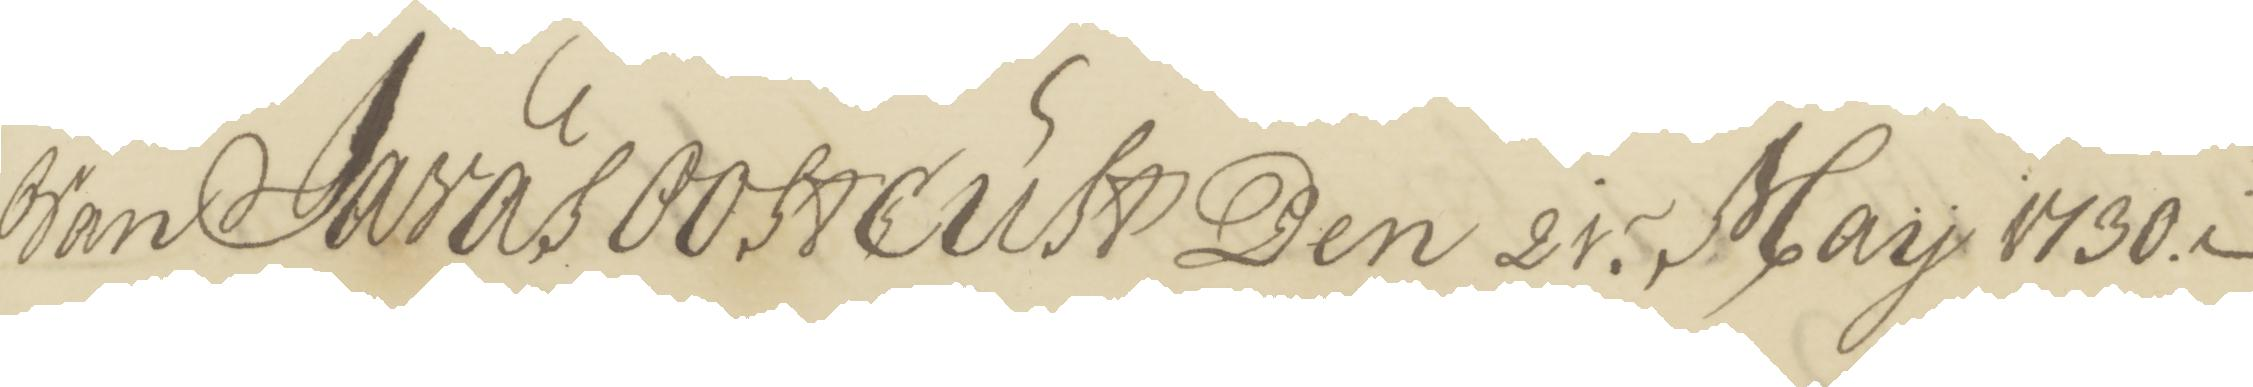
Van Javâs oostcust Den 21.' Maij 1730.
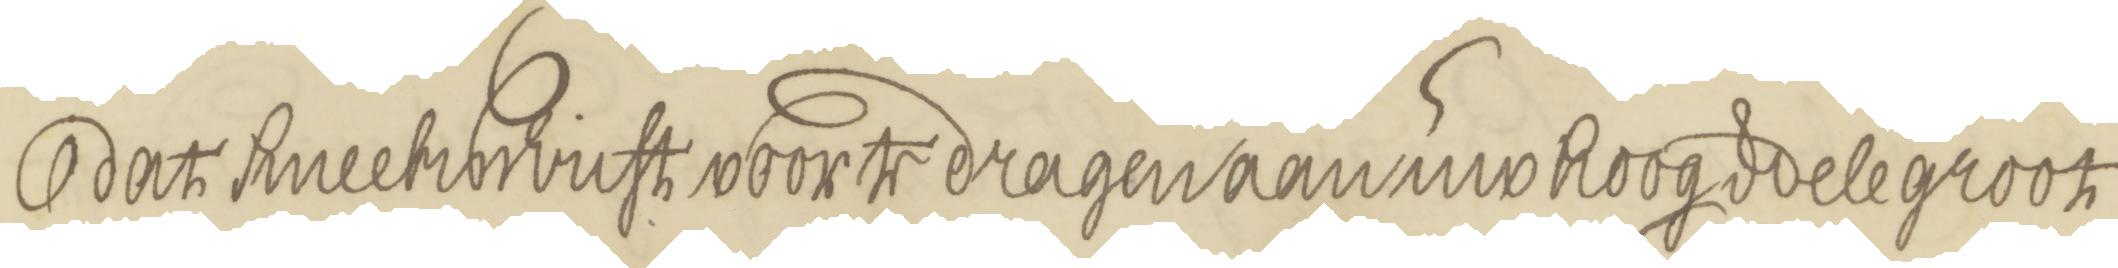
dat smeekschrift voor te dragen aan uw hoog Edele groot
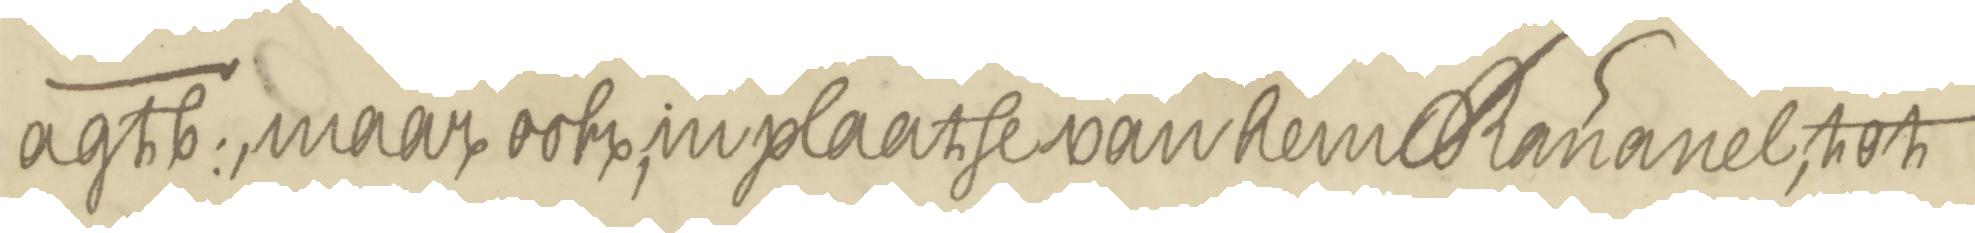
agtb:, maar ook, in plaatse van hem Rauanel, tot
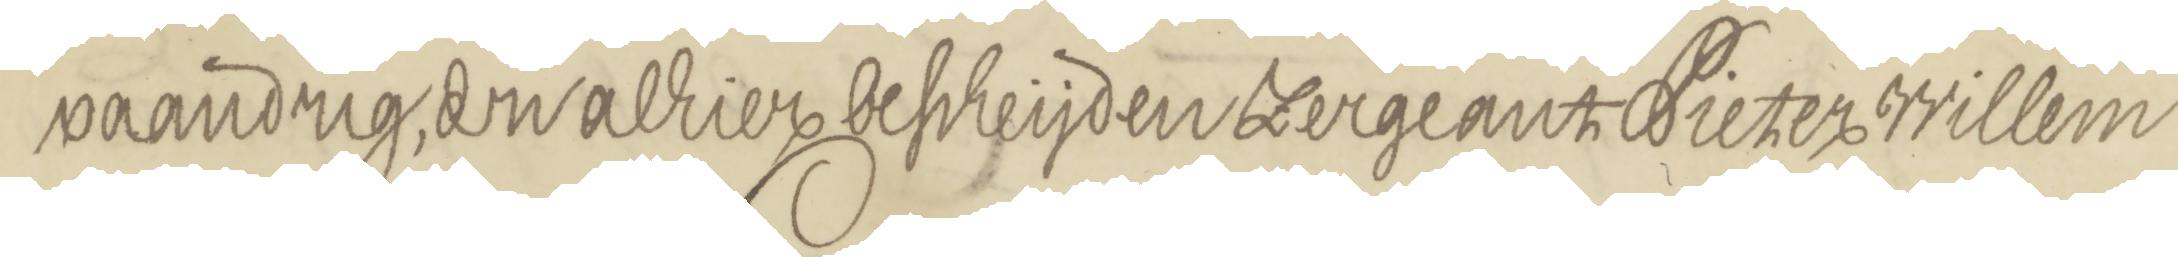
vaandrig, den alhier bescheijden zergeant Pieter Willem
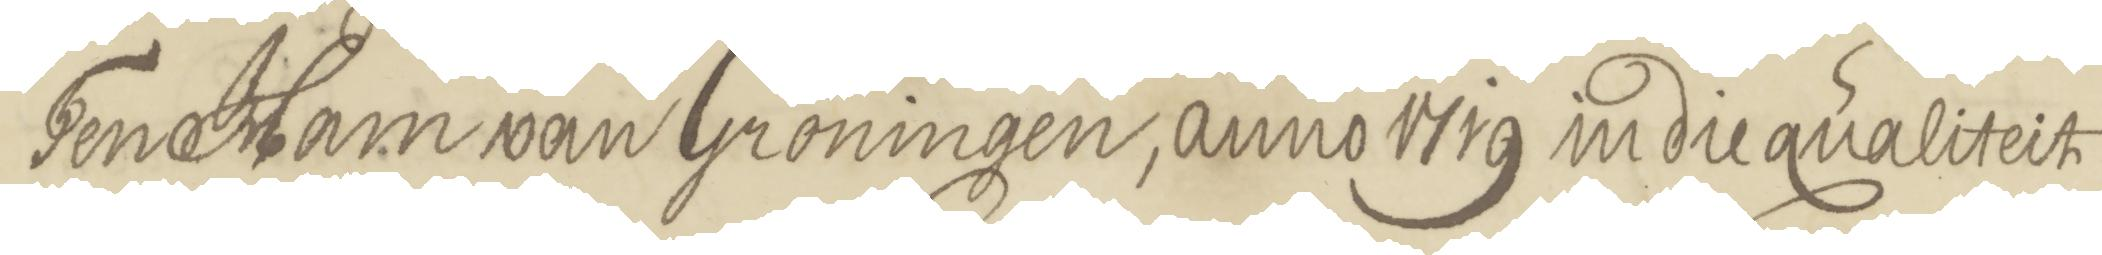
Ten Ham van Groningen, anno 1719 in die qualiteit
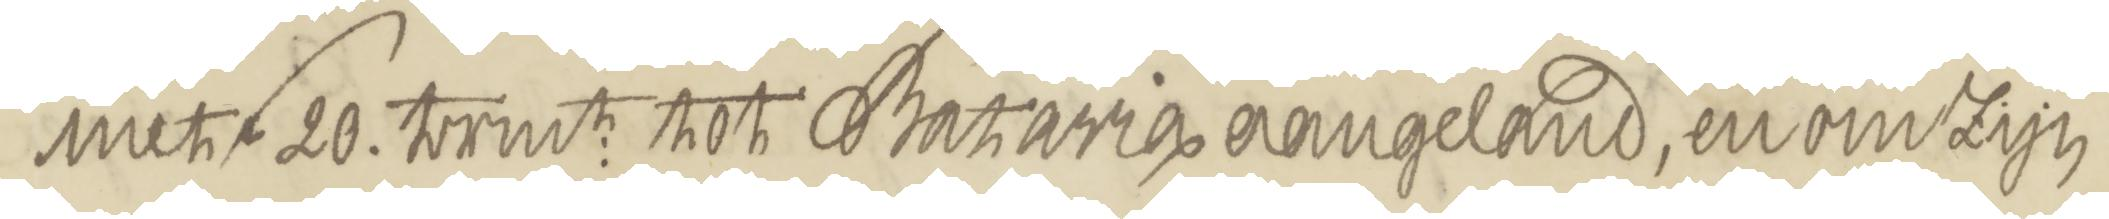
met ƒ20. term:t tot Batavia aangeland, en om zijn
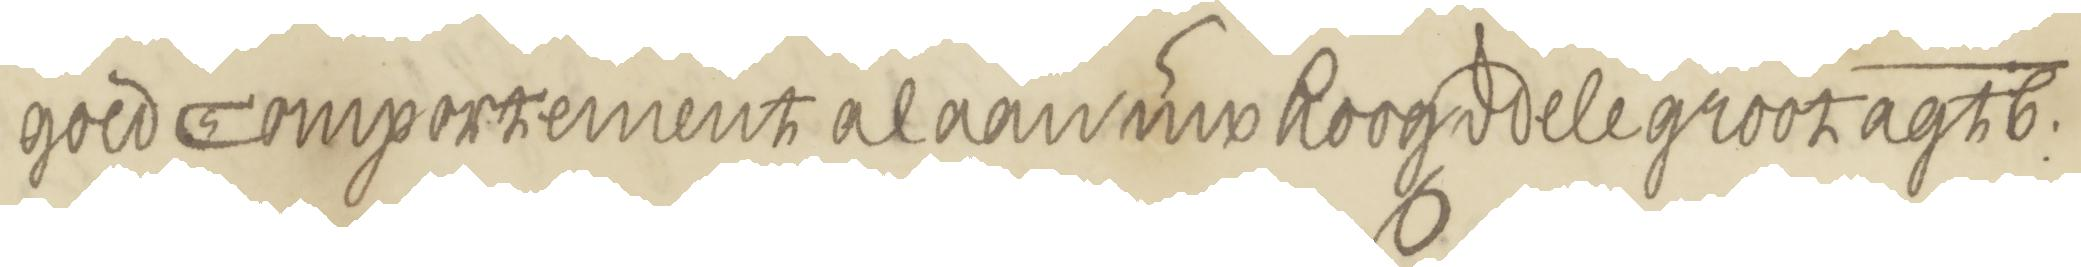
goed comportement al aan uw hoog Edele groot agtb:
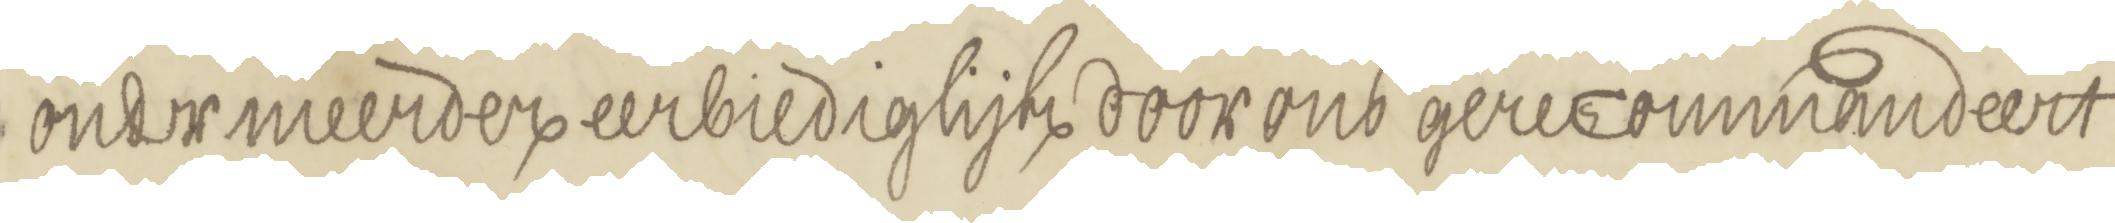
onder meerder eerbiediglijk door ons gerecommandeert
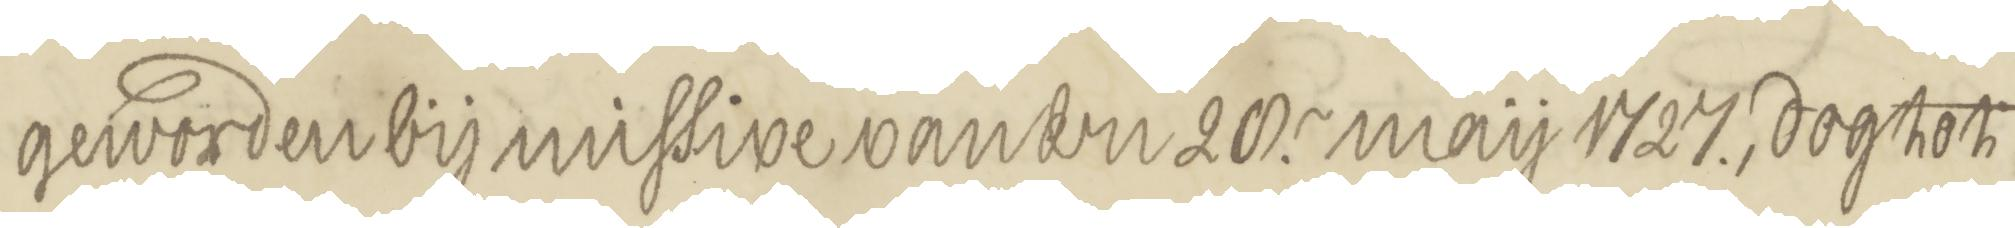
geworden bij missive van den 28.' maij 1727., dog tot
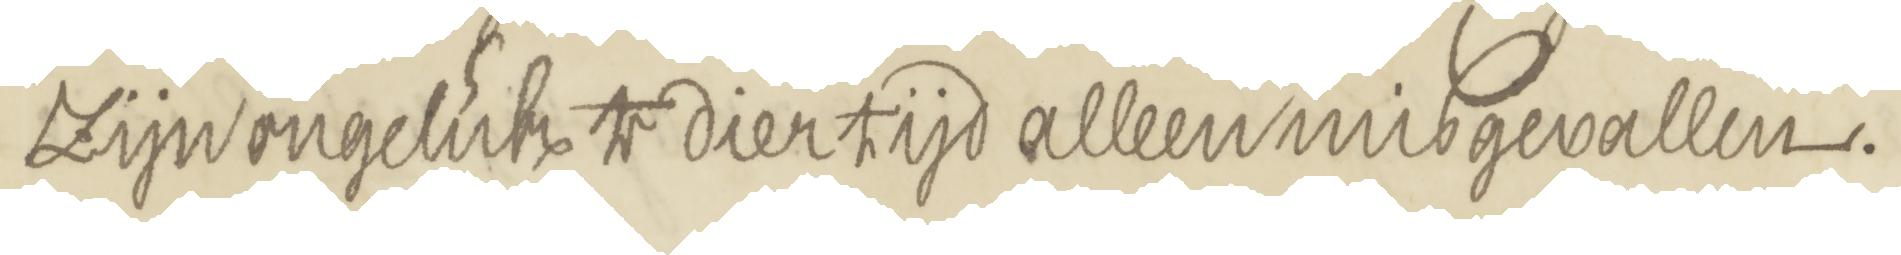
zijn ongeluk te dier tijd alleen misgevallen.
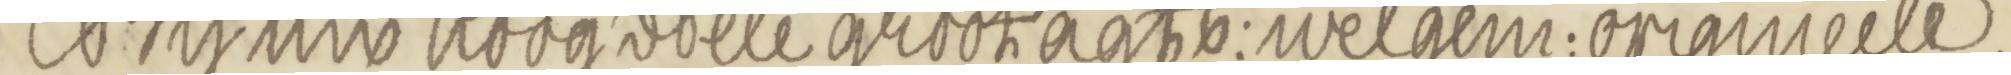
Bij uw hoog Edele groot agtb: welgem: origineele
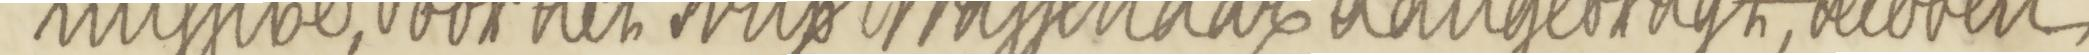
missive, door het schip wassenaar aangebragt, hebben
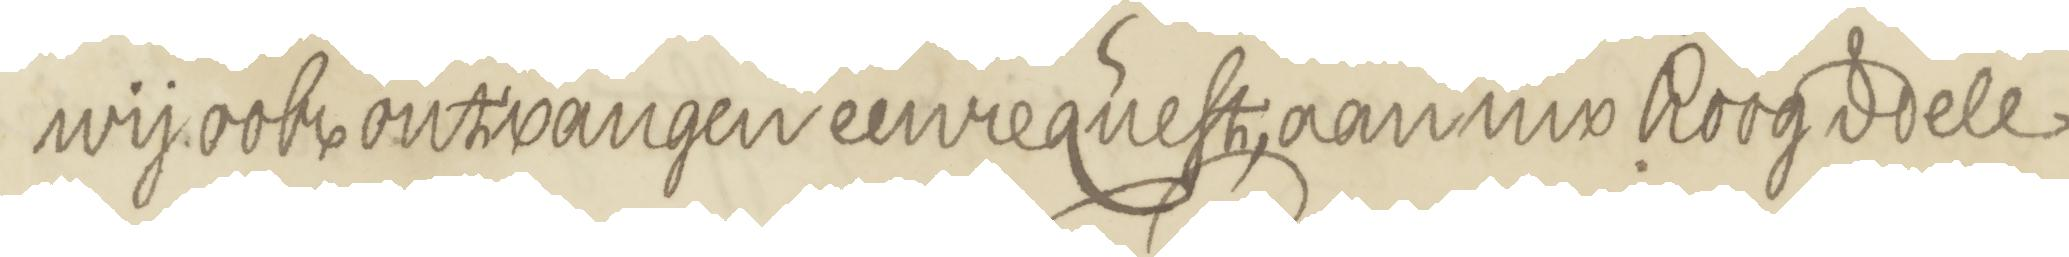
wij ook ontvangen een request, aan uw hoog Edele
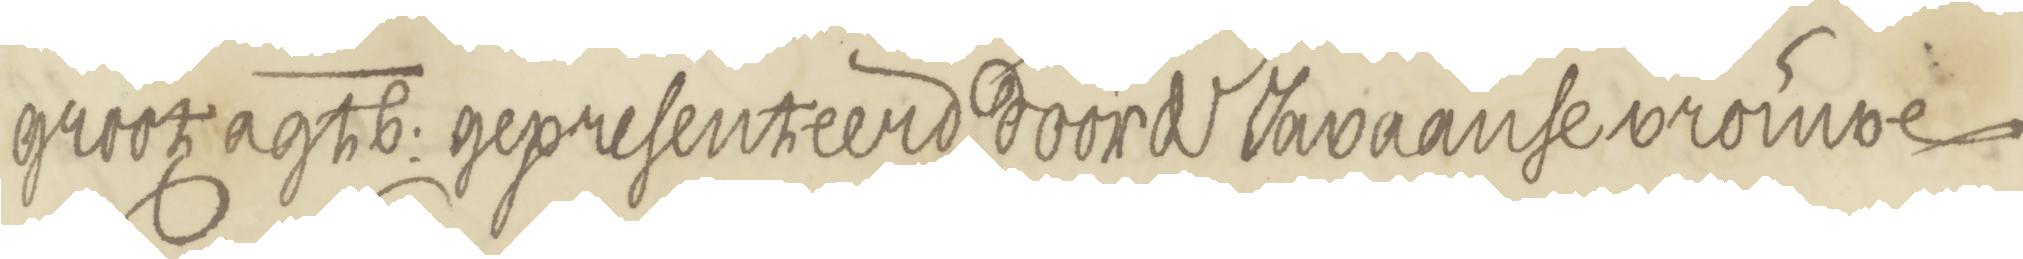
groot agtb: gepresenteerd door de Javaanse vrouwe
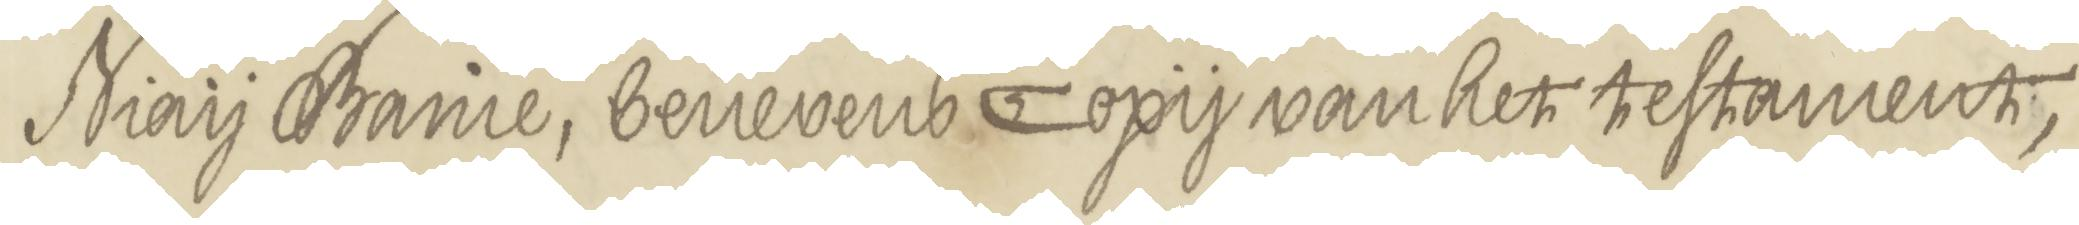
Niaij Banie, benevens copij van het testament,
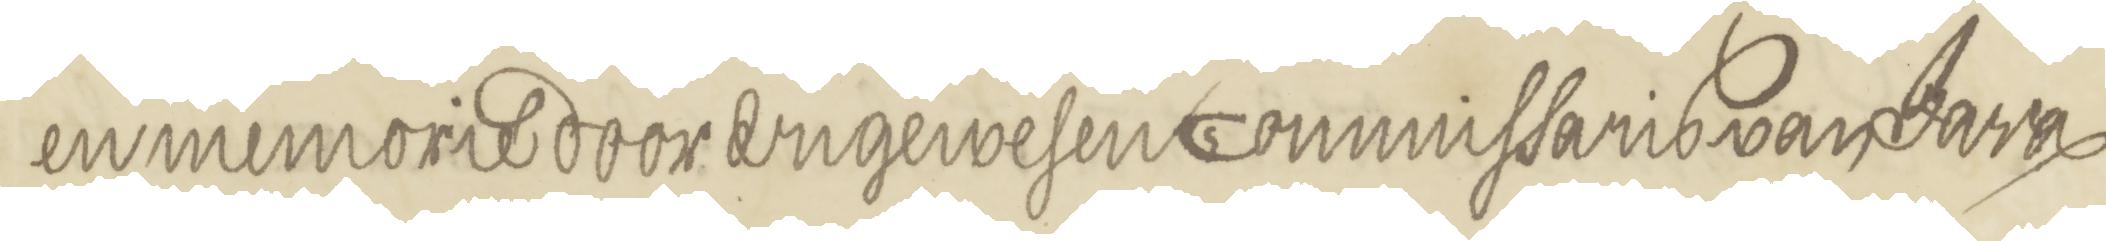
en memorie door den gewesen commissaris van Java
